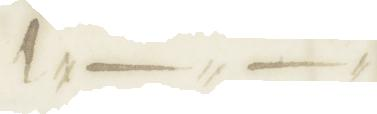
1„ —„—„
